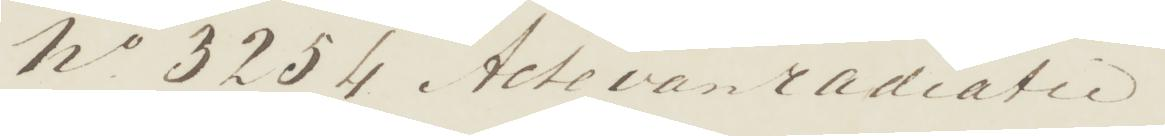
No 3254 Acte van radiatie
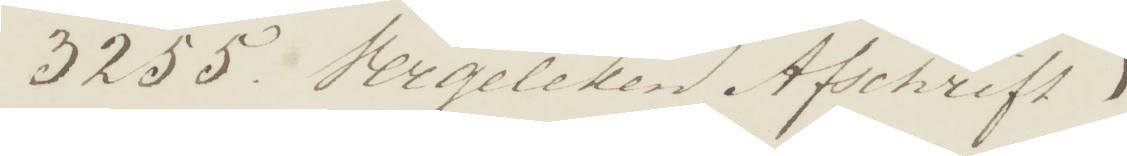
3255. Vergeleken Afschrift
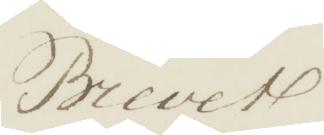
Brevet
